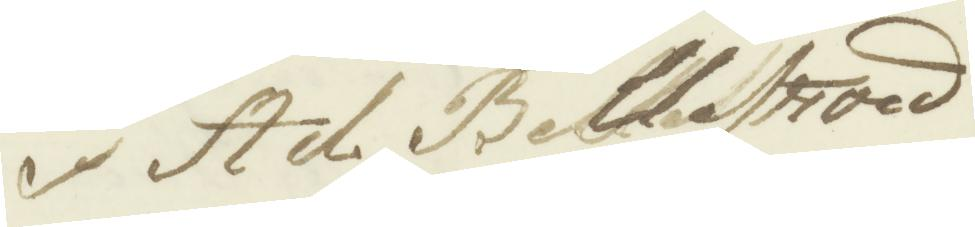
J A d. Bellefroid
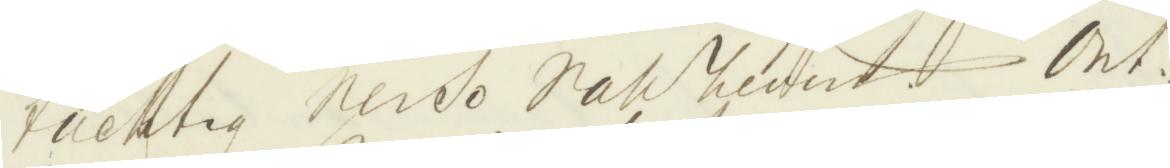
tachtig verso vakZeven Ont
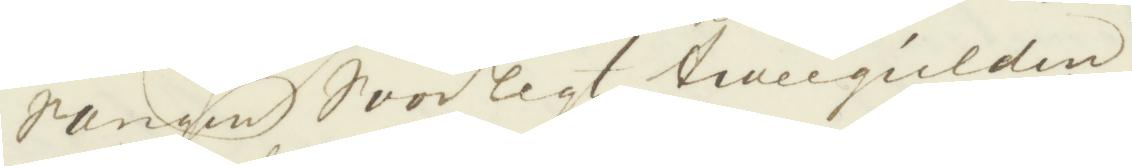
vangen voorregt tweegulden
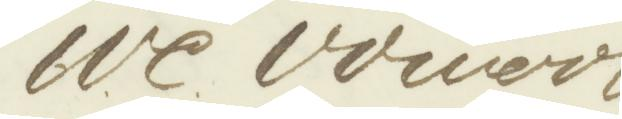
WC Vdwerff
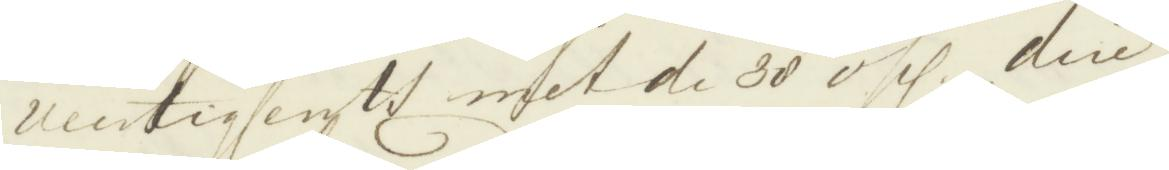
veertig Cents met de 38 opC. drie
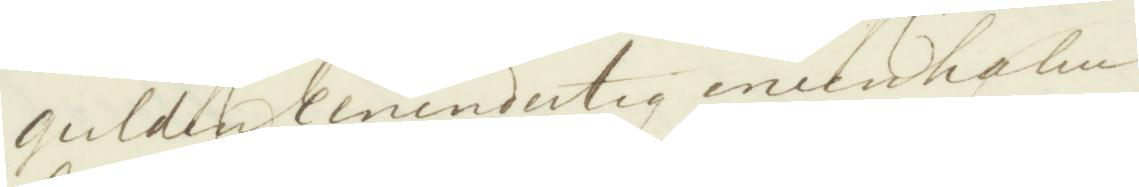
gulden Eenendertig eneenhalve
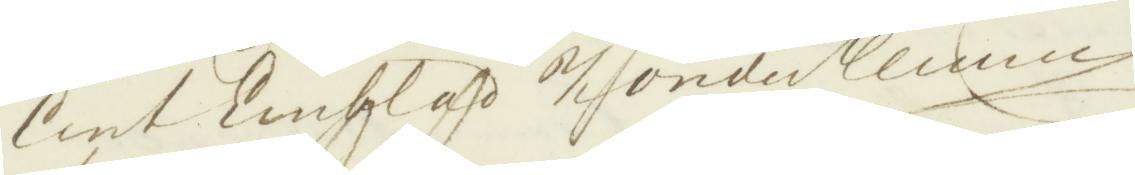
Cent Eenblad ZonderRenvoy
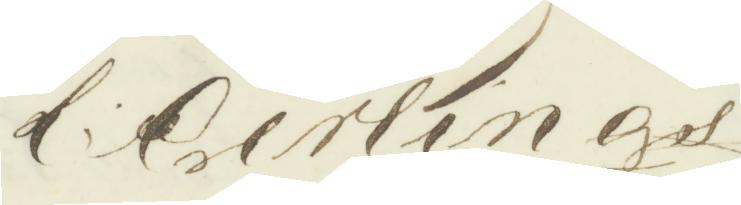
C:Gerlings
